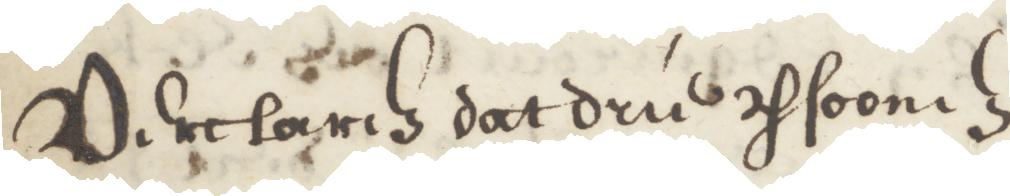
Verclaren dat drie persoonen
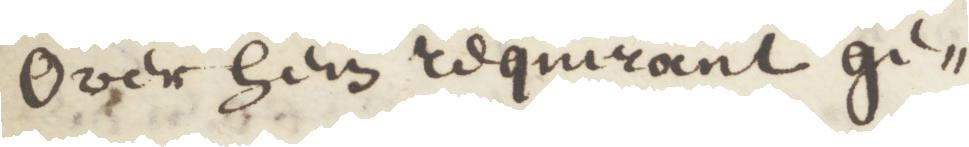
Over hem requirant ge„
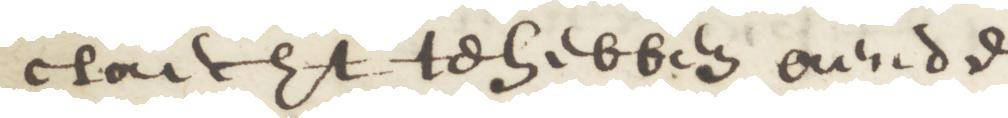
claecht tehebben aende
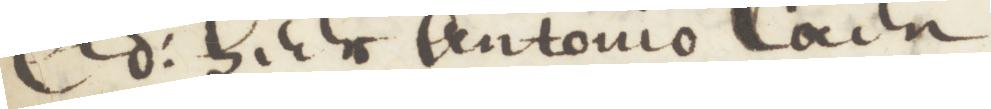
Ed: heer Antonio Caen
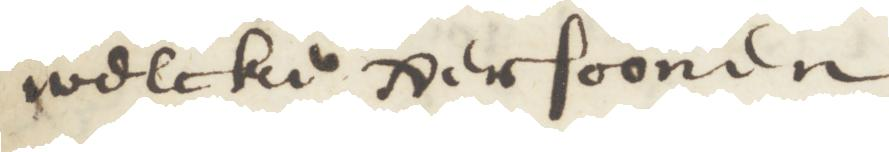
welcke persoonen
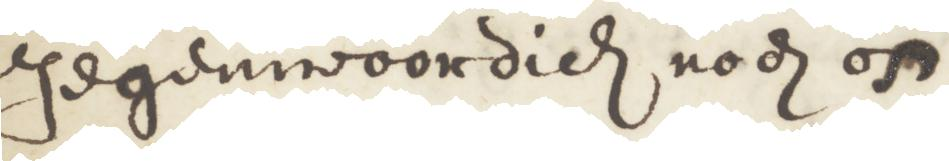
Jegenwoordich noch op
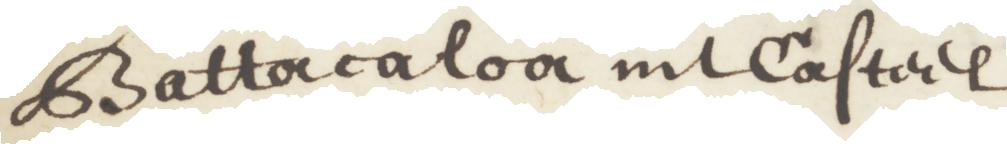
Battacaloa int Casteel
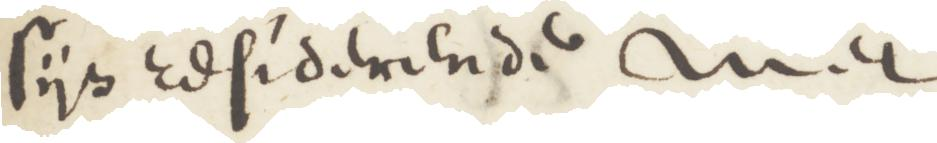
sijn residerende met
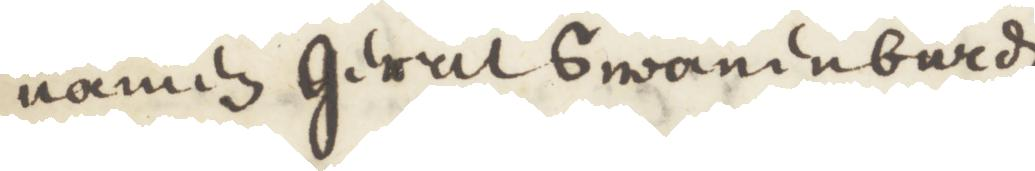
namen gerrit swanenburch
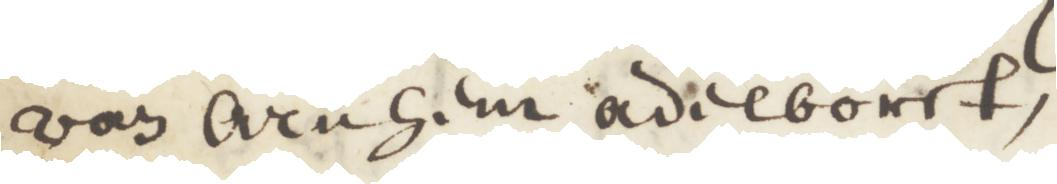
van arnhem adelborst,
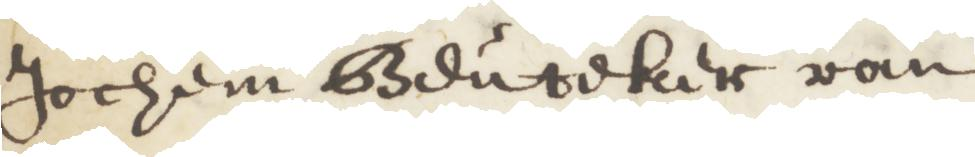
Jochem Beuteker van
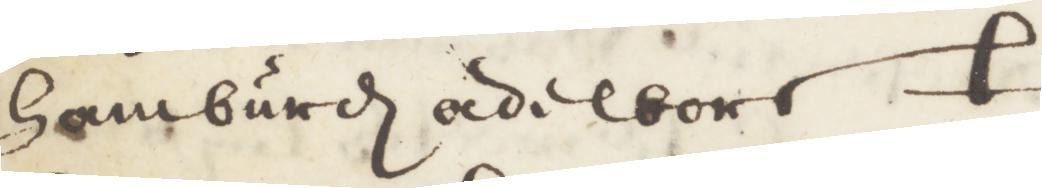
Hamburch adelborst
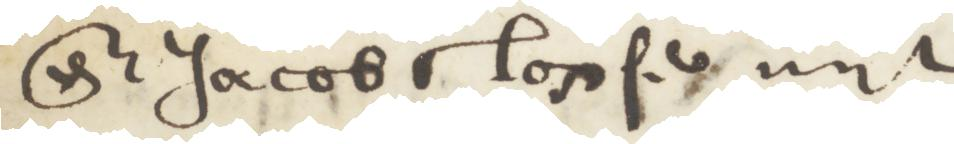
ende Jacob slopse uijt
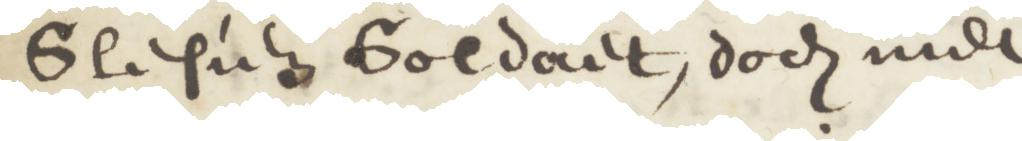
slesien soldaet, doch niet
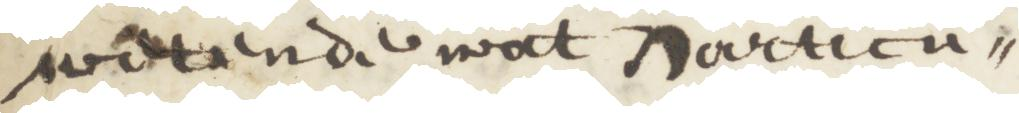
wetende wat particu„
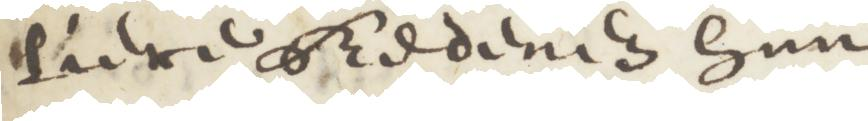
liere Redenen hun
